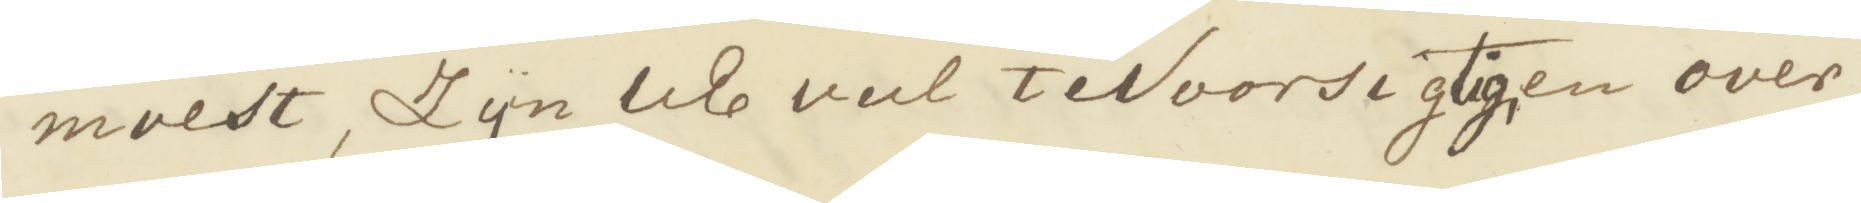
moest, zijn uE veel te voorsigtigen over
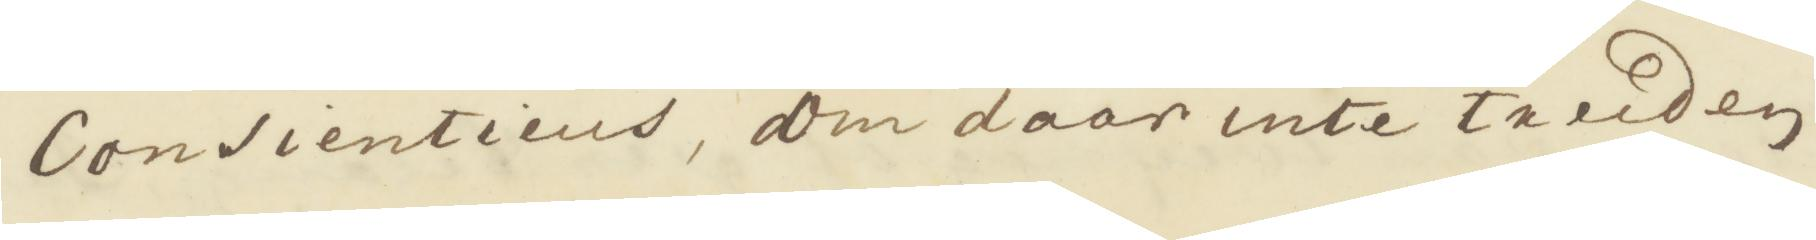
consientieus, om daar inte treeden
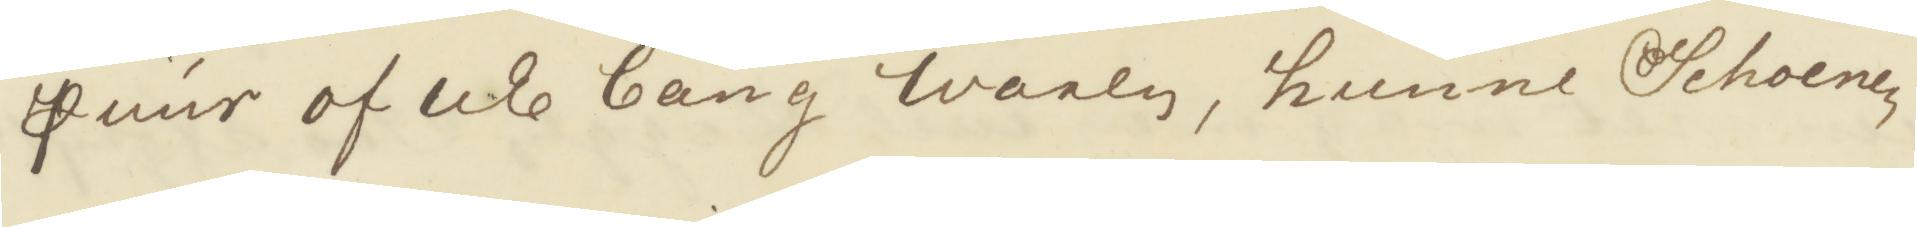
puur of uE bang waren, hunne Schoenen
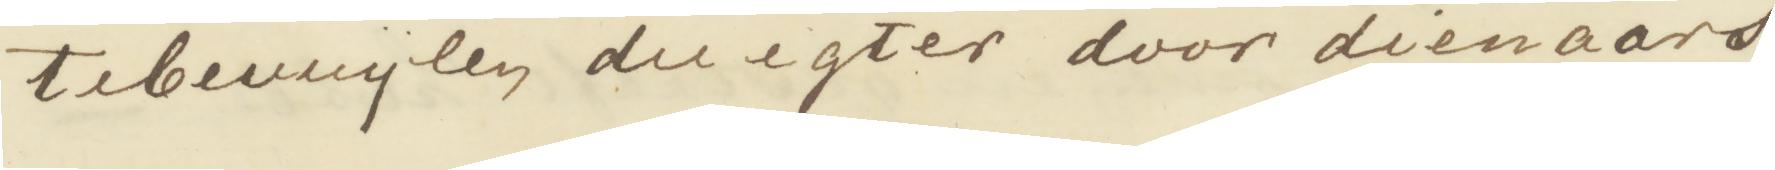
te bevuijlen die egter door dienaars
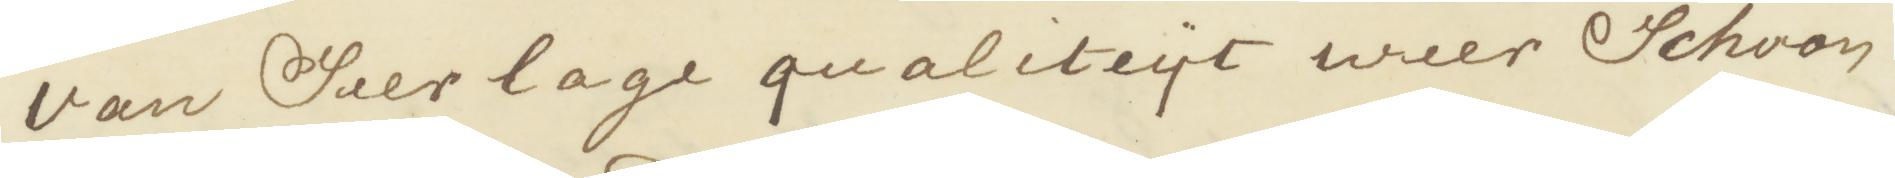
van Seer lage qualiteijt weer schoon
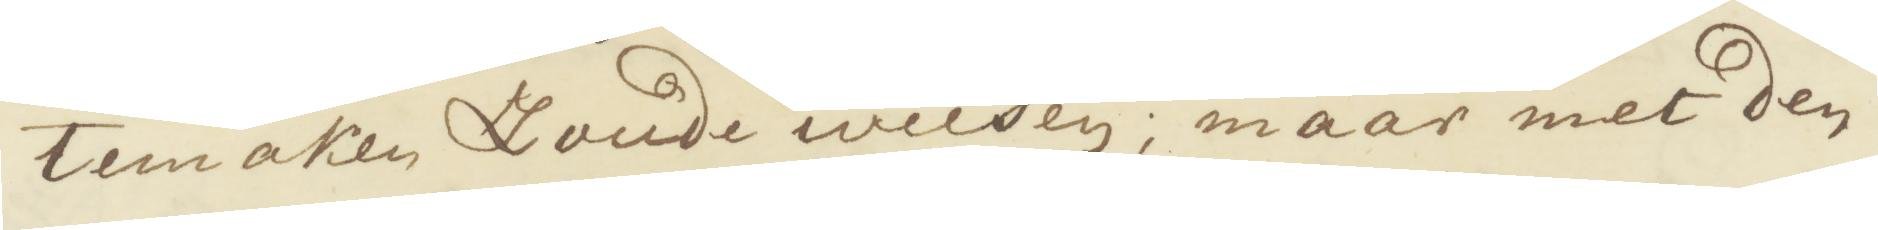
temaken zoude weesen; maar met den
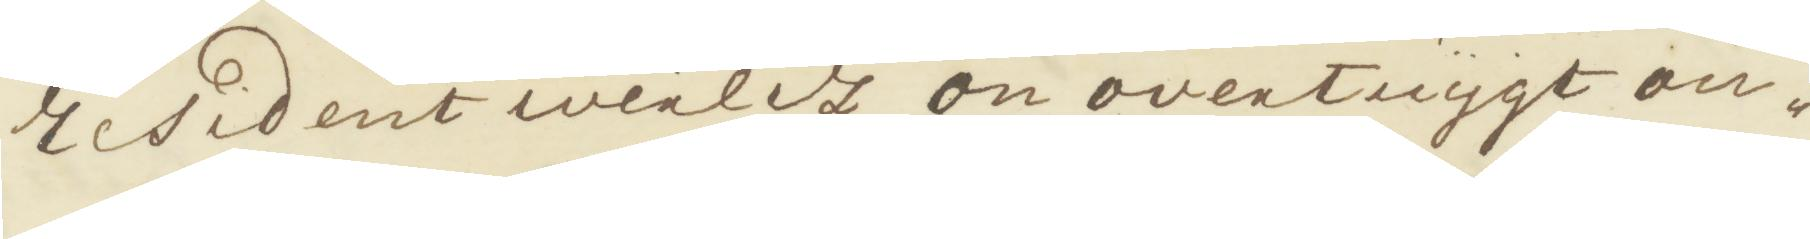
resident werliz on overtuijgt on„
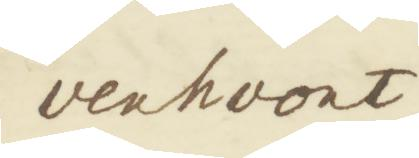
verhoort
